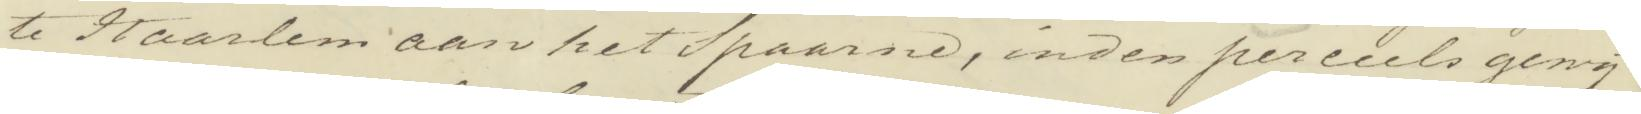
te Haarlem aan het Spaarne, in den perceels gewij
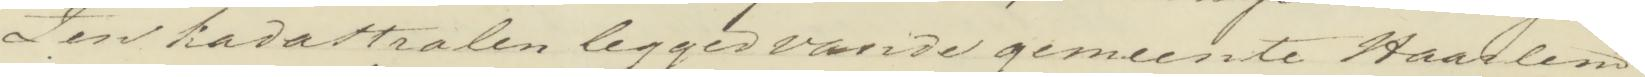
Zen kadastralen legger van de gemeente Haarlem
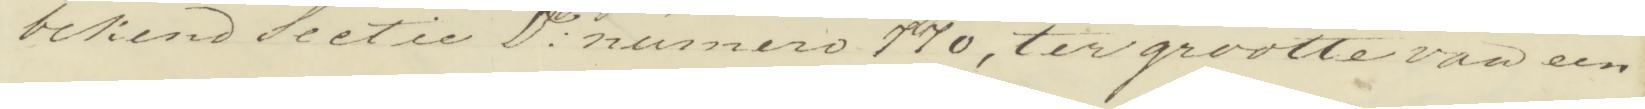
bekend sectie D: numero 770, ter grootte van een
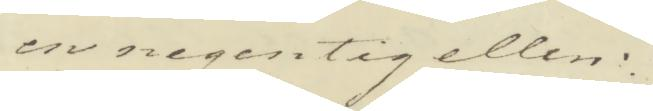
en negentig ellen
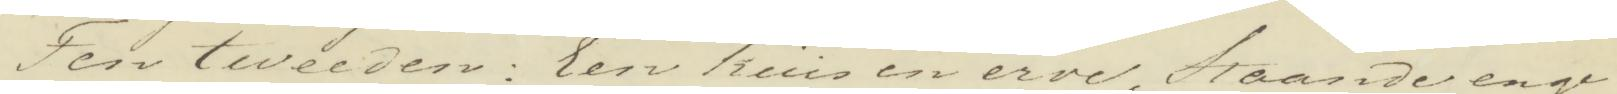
Ten tweeden: Een huis en erve, Staande en ge
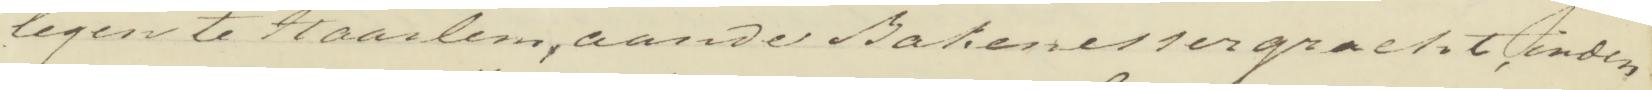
legen te Haarlem, aan de Bakenessergracht, inden
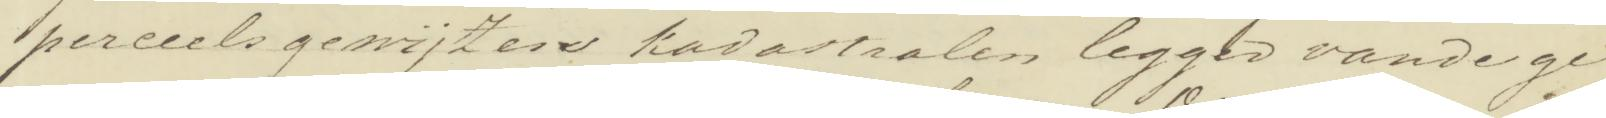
perceels gewijZen kadastralen legger vande ge
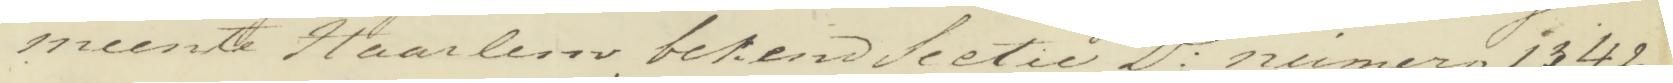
meente Haarlem bekend sectie D: numero 1342,
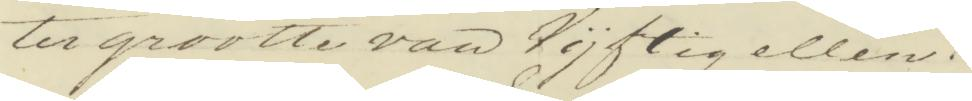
ter grootte van Vijftig ellen.
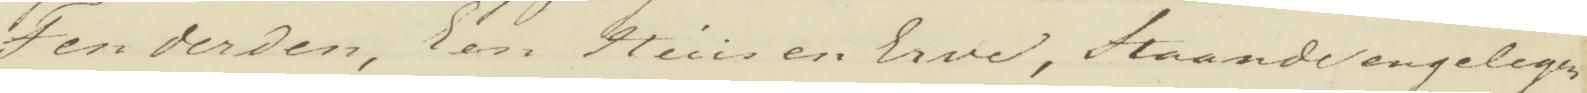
Ten derden, Een Huis en Erve, Staande en gelegen
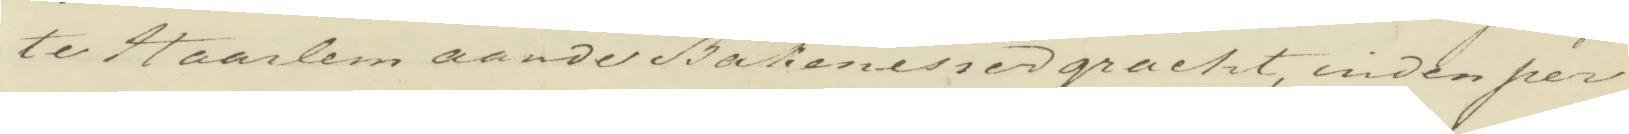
te Haarlem aan de Bakenesser gracht, in den per
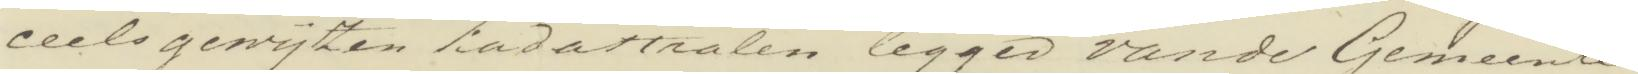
ceels gewijZen kadastralen legger vande Gemeente
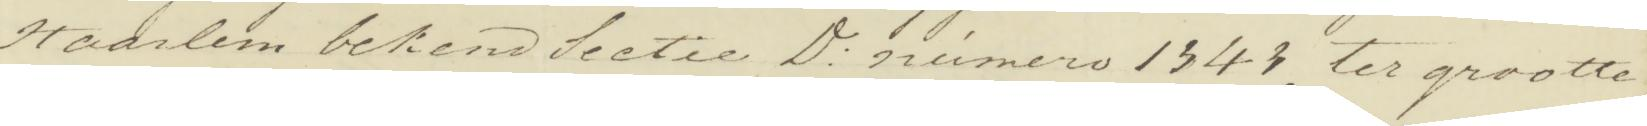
Haarlem bekend sectie D: numero 1343, ter grootte
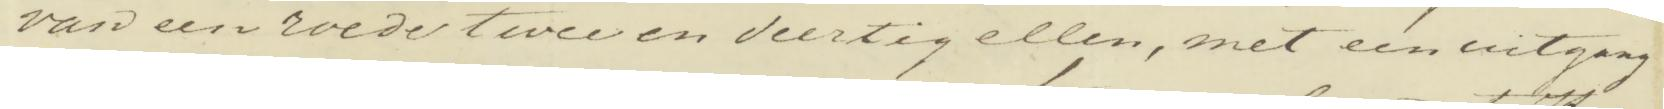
van een roede twee en veertig ellen, met een uitgang
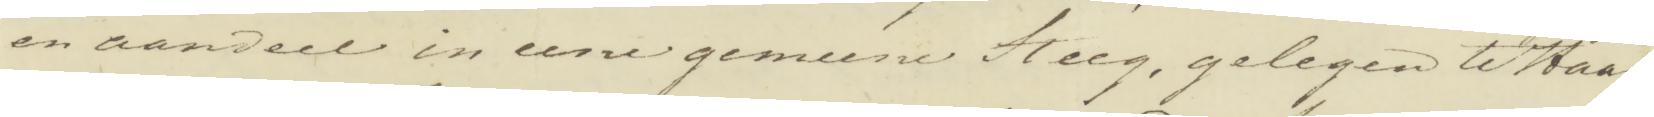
en aandeel in eene gemeene Steeg, gelegen te Haar
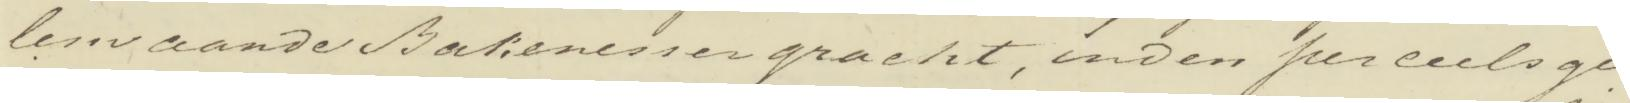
lem aande Bakenesser gracht, in den perceels ge
